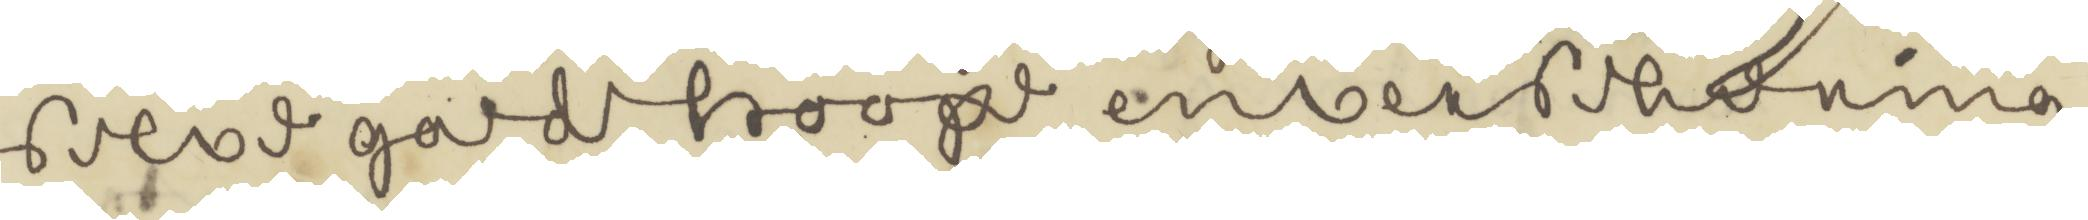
selve goede hoope en versekering
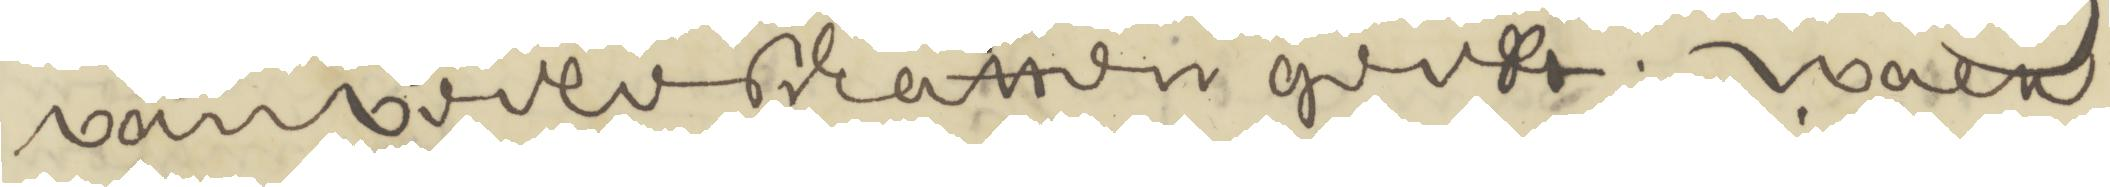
van veele schatten geeft; waer
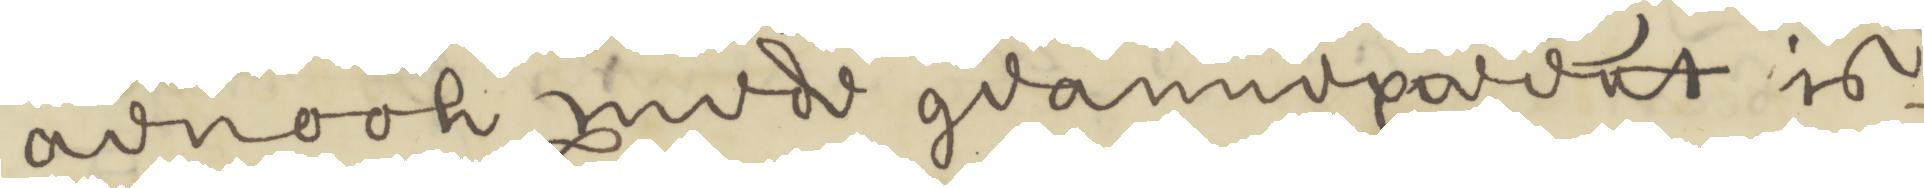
aen ook mede geannexeert is
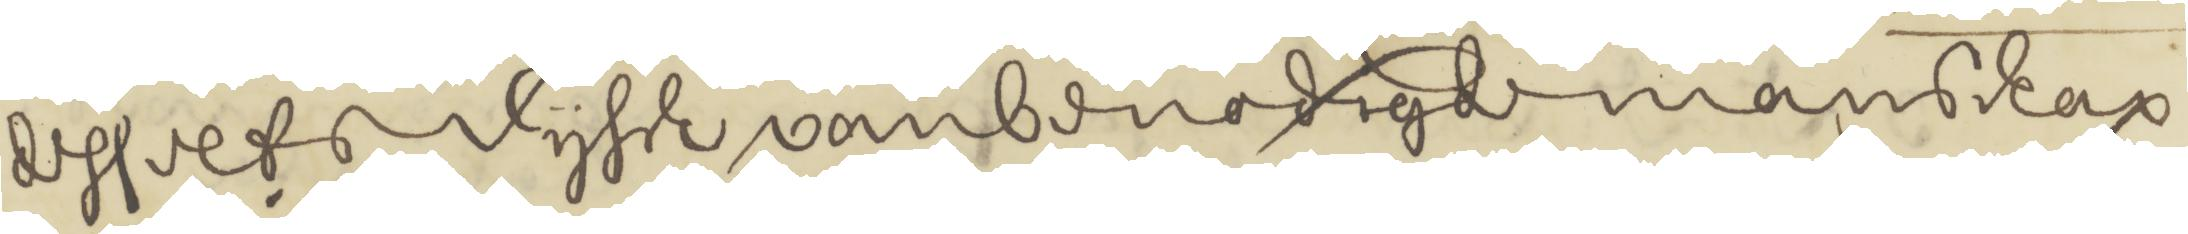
desselfs eijsch van benodigde manschap
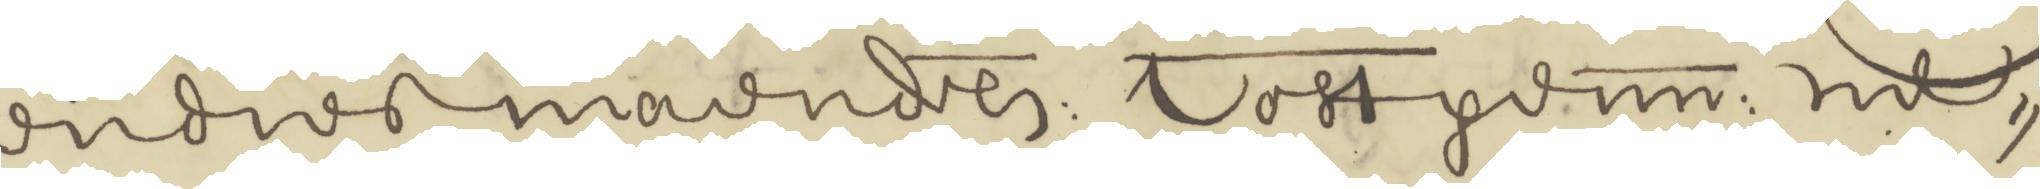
en dies maendelijk: Costpenn: ne„
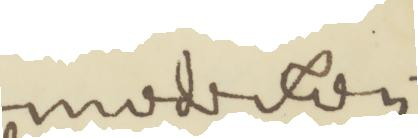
soo mede den
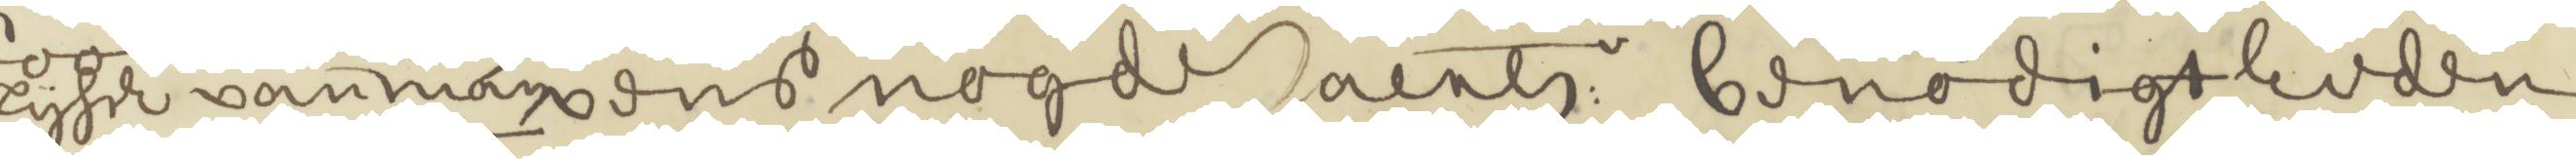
eijsch van man vens nog de Iaerlijks:e benodigtheden
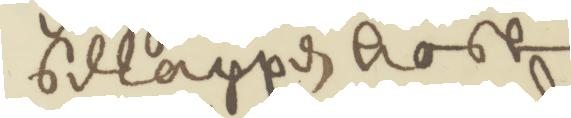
schappen kost
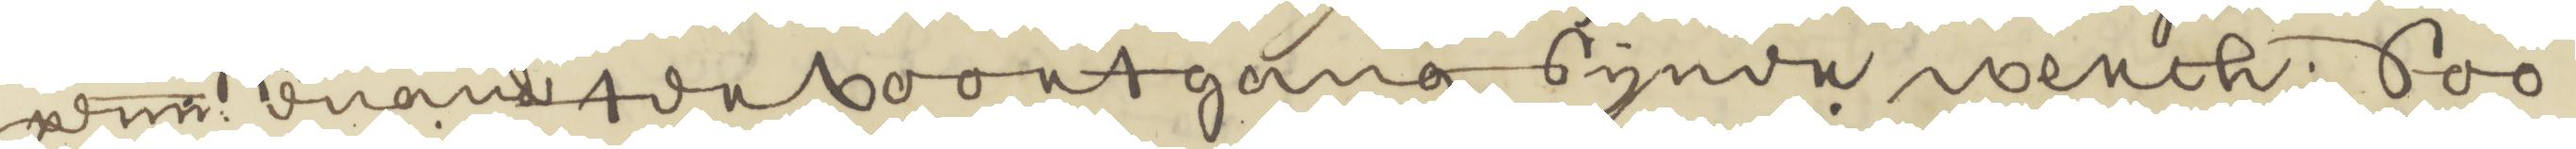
penn: en and ter voortgang sijnen werck; soo
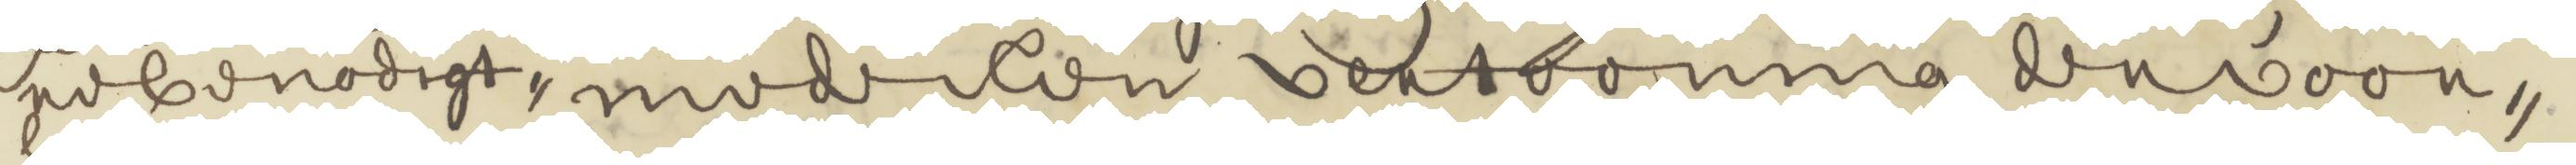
re benodigt„ mede een vertooning der voor„
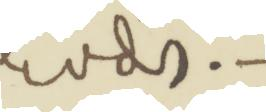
heden.
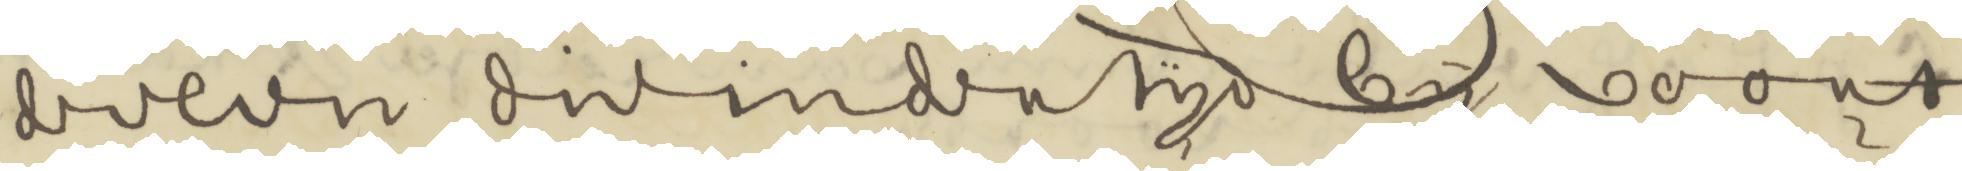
deelen die in der tijd bij voort
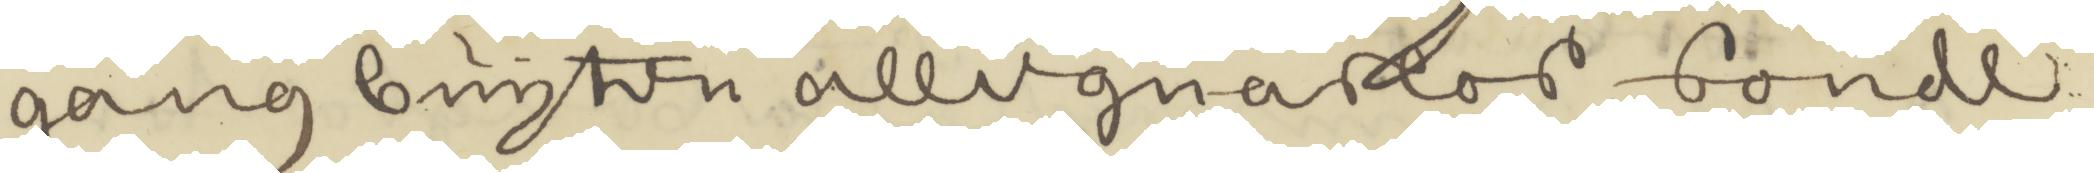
gang buijten alle guastos soude
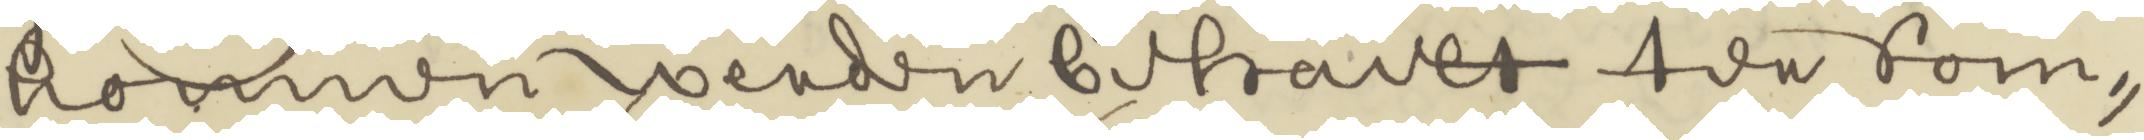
koomen werden behaelt ter som„
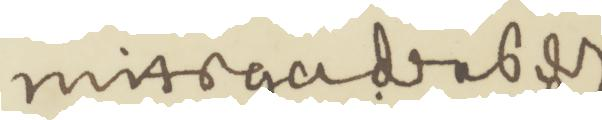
mitsgaders en
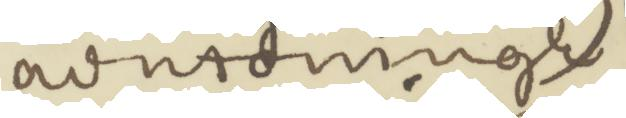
aentoningh
